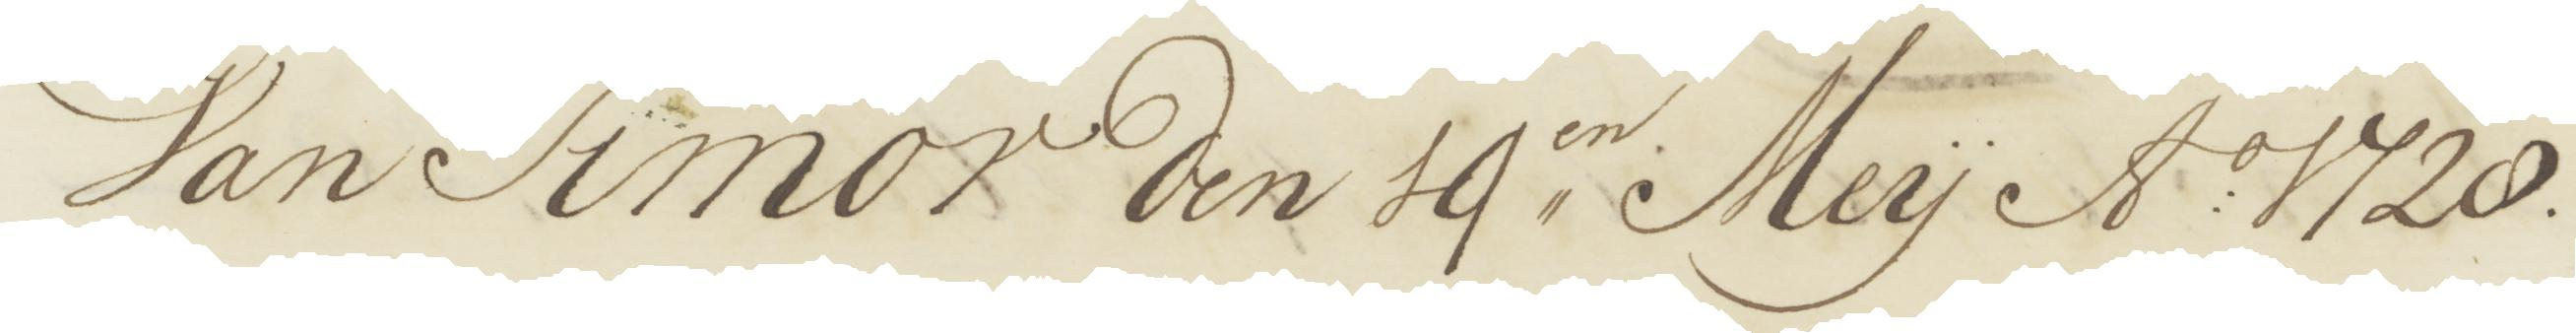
Van Timor den 14„en Meij A:o 1728.
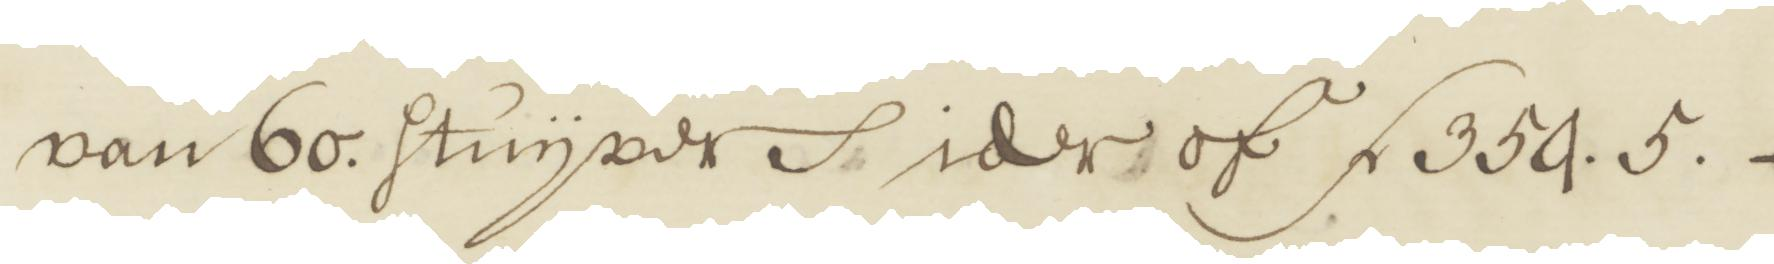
van 60. stuijvers ider of ƒ 354.5. -
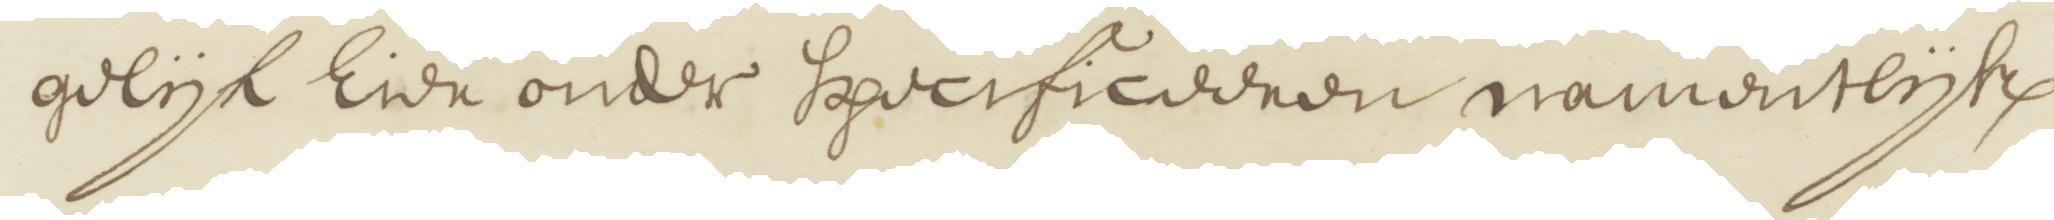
gelijk hier onder specificeeren namentlijk
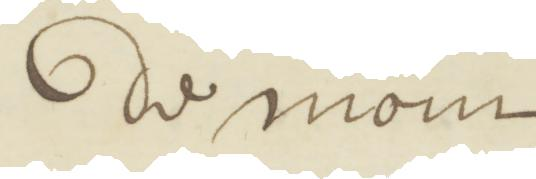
de mom
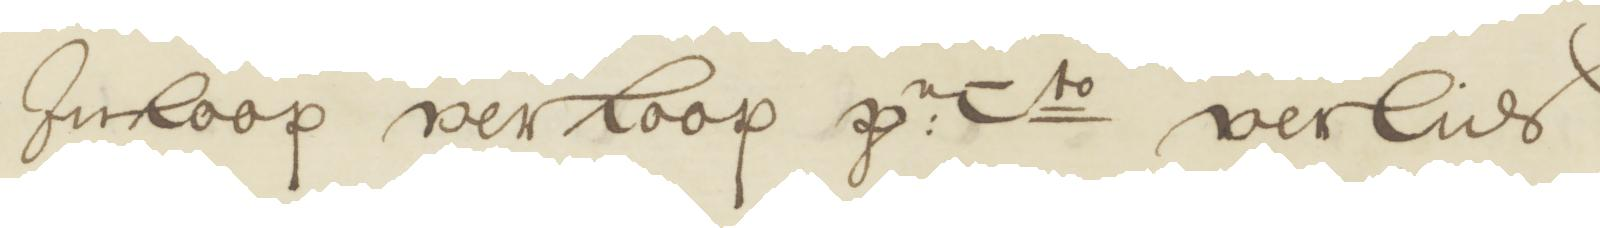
Inkoop verkoop p:r C=to verlies
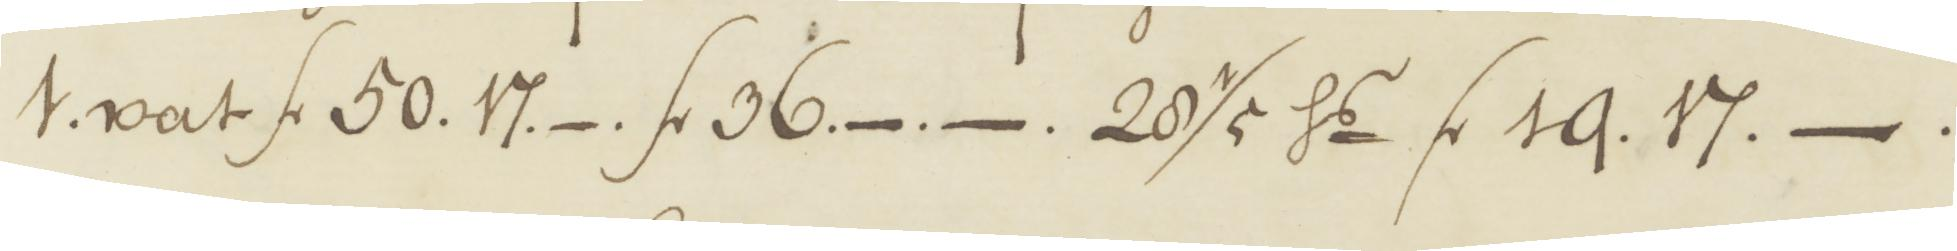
1. vat ƒ 50.17.—. ƒ 36.—.—. 28 1/5 s=s ƒ 14. 17.—.
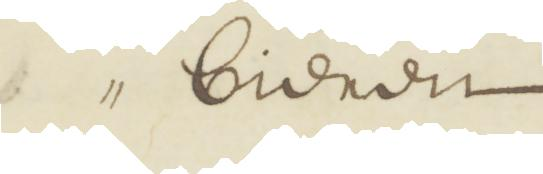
„ bieren
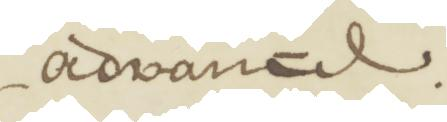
advance.
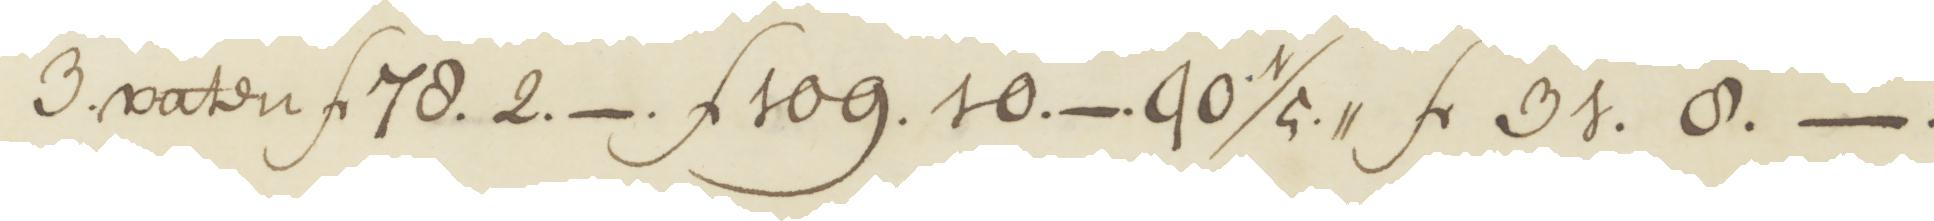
3. vaten ƒ 78.2.—. ƒ 109.10.—.40 1/5.„ ƒ 31. 8.—.
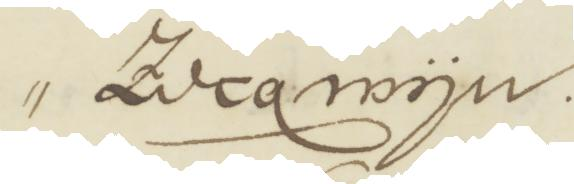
„ Zecqwijn.
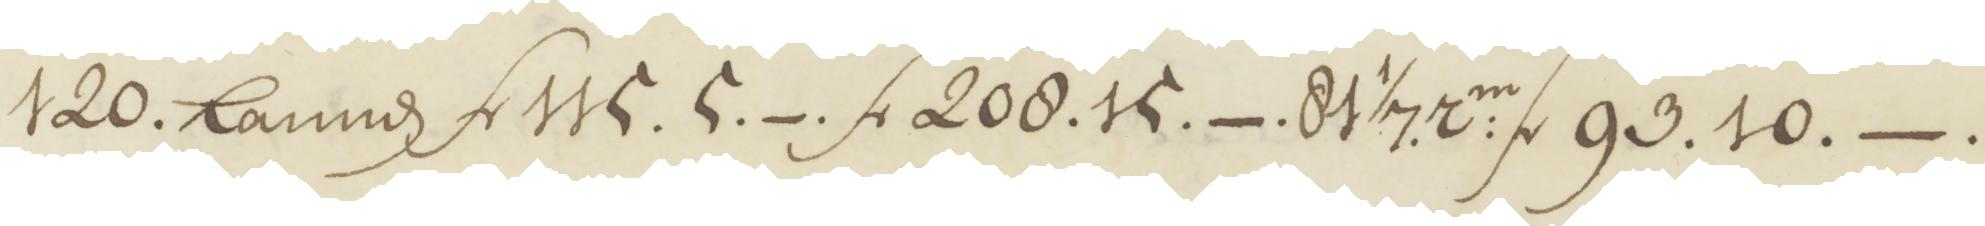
120. kannen ƒ 115. 5.—. ƒ 208.15.—. 81 1/7. r:m ƒ 93.10.—.
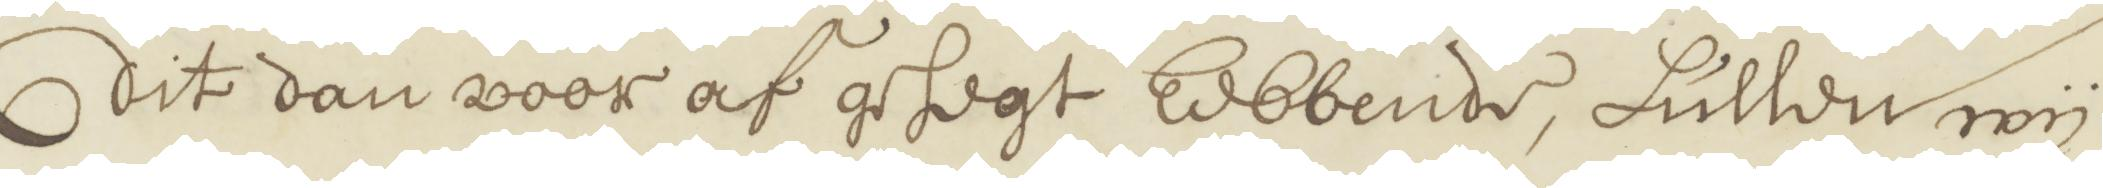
dit dan voor af gesegt hebbende, sullen wij
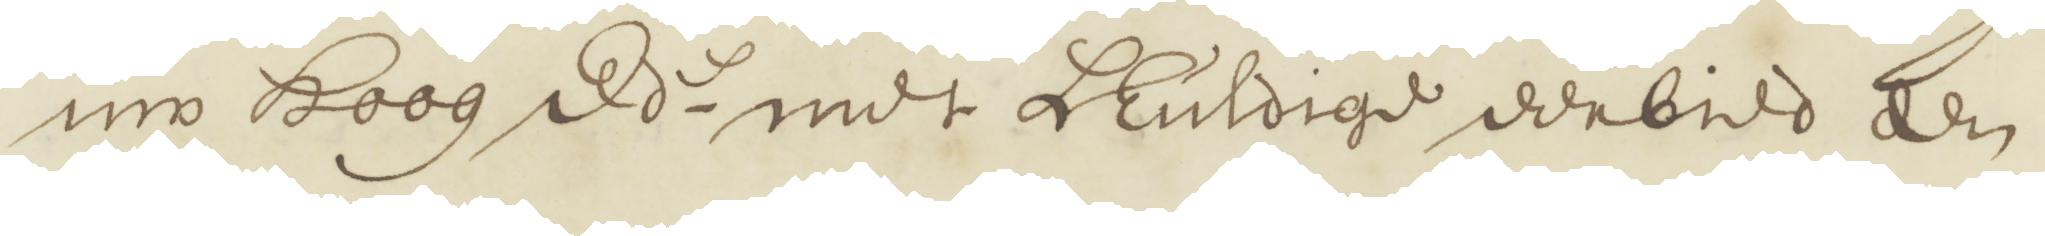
uw Hoog Ed=s met schuldige eerbied den
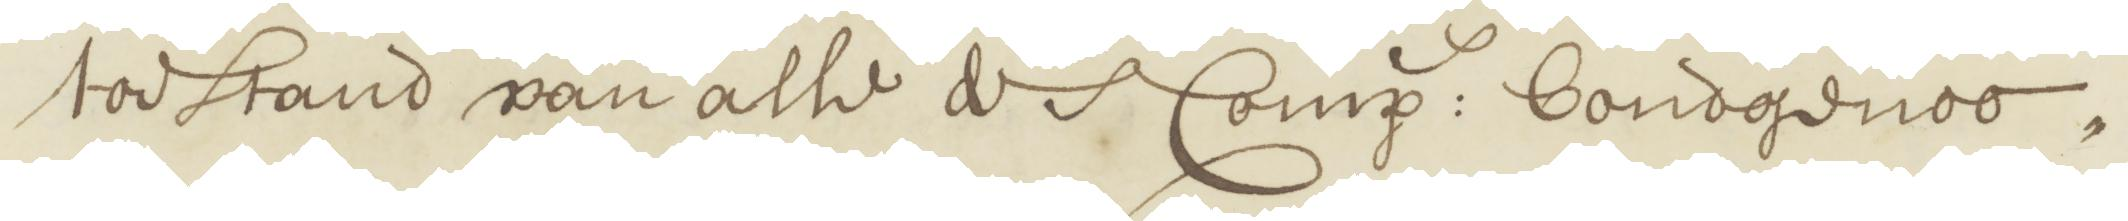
toestand van alle desComp:s bondgenoo„
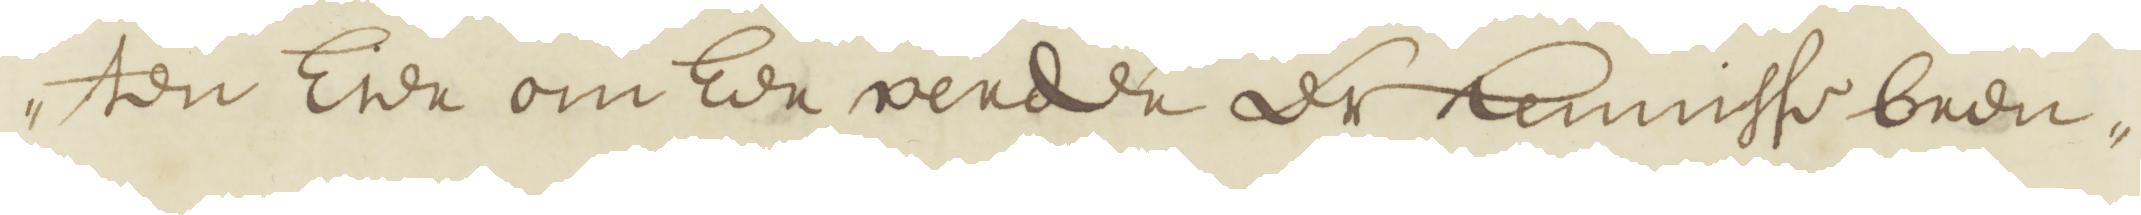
„ten hier om her verder ter kennisse bren„
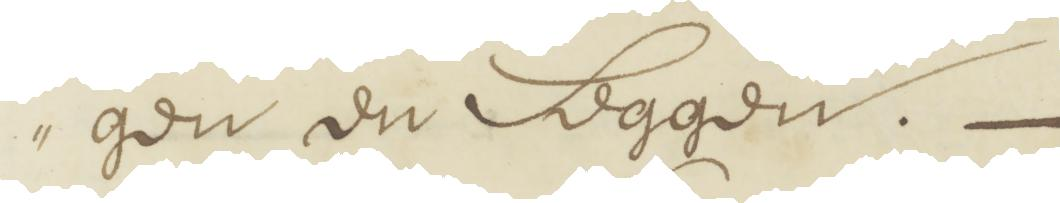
„gen en seggen. —
